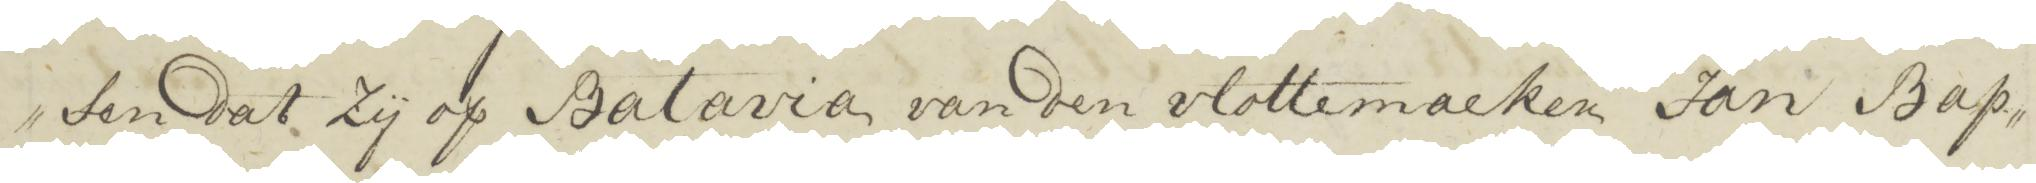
„sen dat Zij op Batavia van den vlottemaeker Ian Bap„
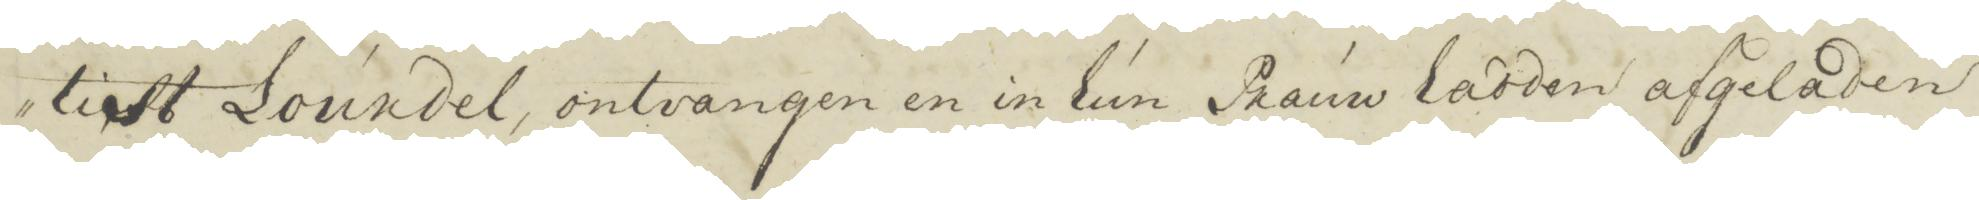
„tist Lourdel, ontvangen en in hun Prauw hadden afgeladen
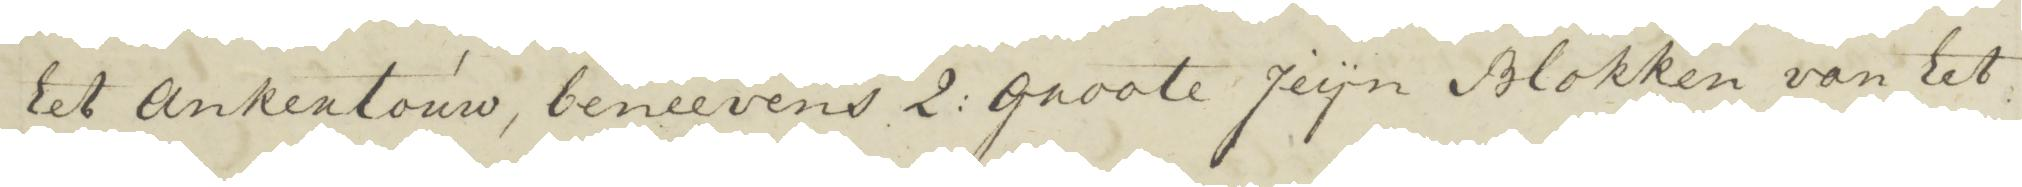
het ankertouw, beneevens 2: groote jeijn Blokken van het
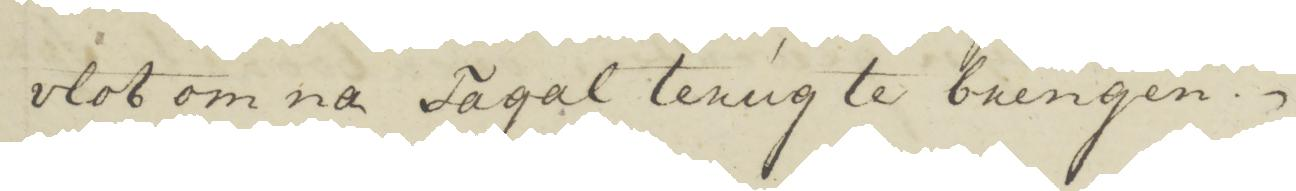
vlot om na Tagal terug te brengen.
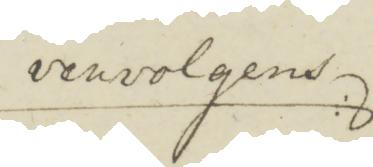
vervolgens : -
